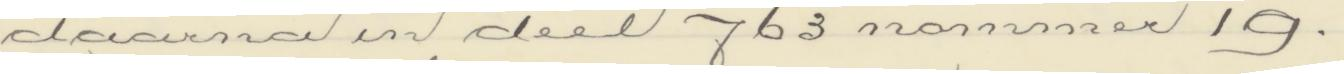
daarna in deel 763 nommer 19.
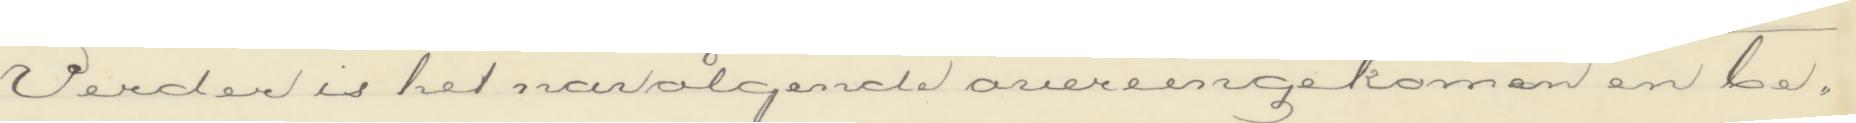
Verder is het navolgende overeengekomen en be„
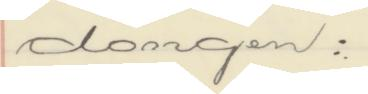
dongen:.
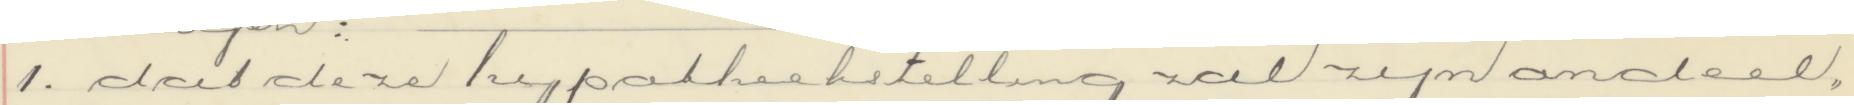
1. dat deze hypotheekstelling zal zijn ondeel„
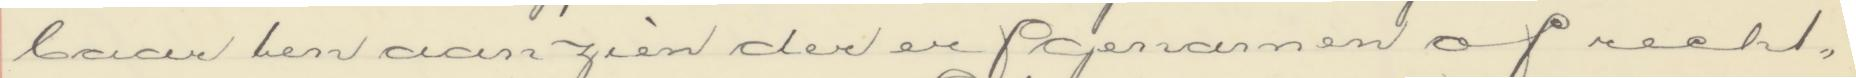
baar ten aanzien der erfgenamen of recht„
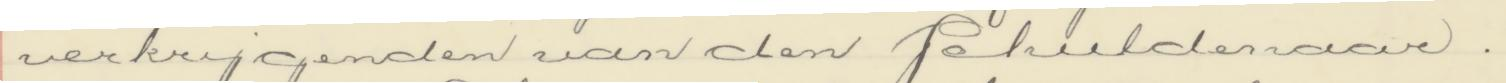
verkrijgenden van den schuldenaar.
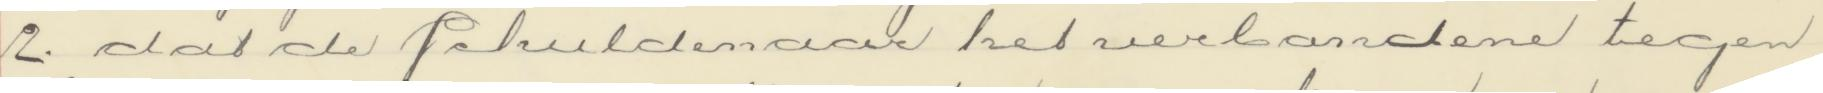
2. dat de schuldenaar het verbondene tegen
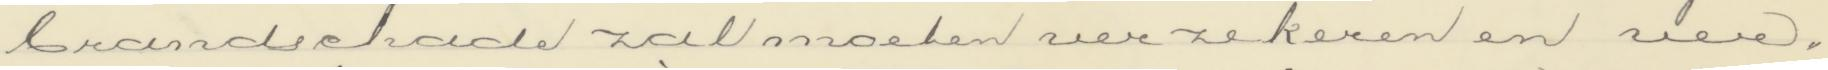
brandschade zal moeten verzekeren en ver„
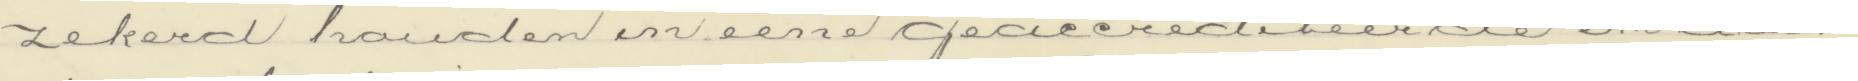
zekerd houden in eene geaccrediteerde en door
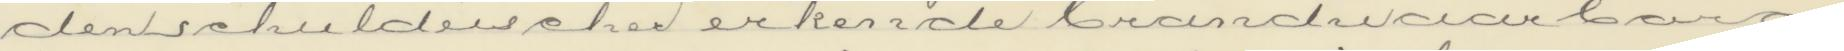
den schuldeischer erkende brandwaarborg
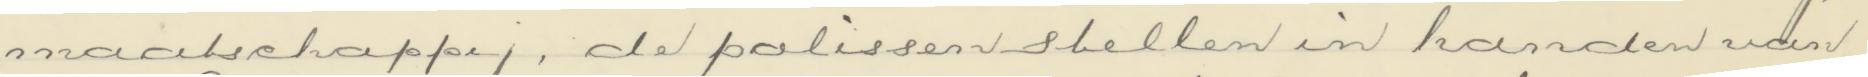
maatschappij, de polissen stellen in handen van
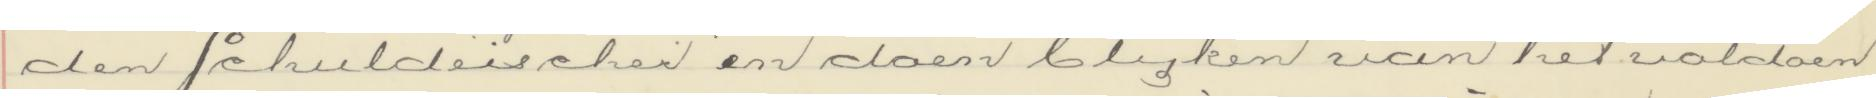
den schuldeischer en doen blijken van het voldoen
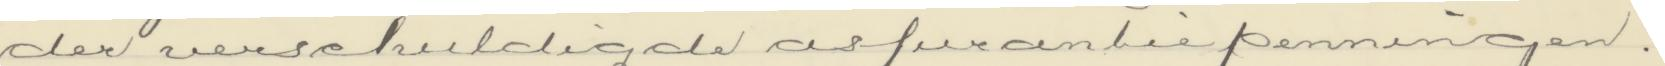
der verschuldigde assurantie penningen.
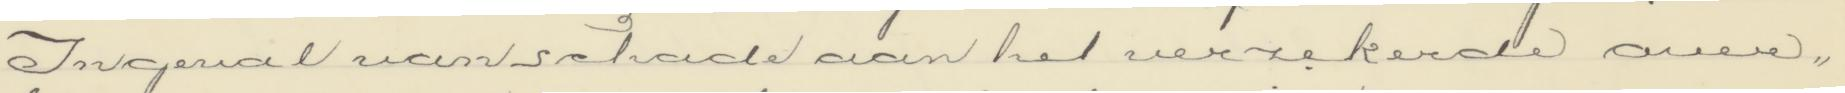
Ingeval van schade aan het verzekerde over„
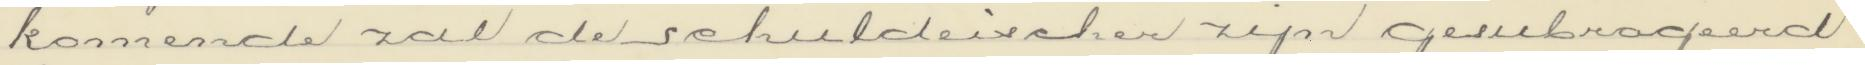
komende zal de schuldeischer zijn gesubrogeerd
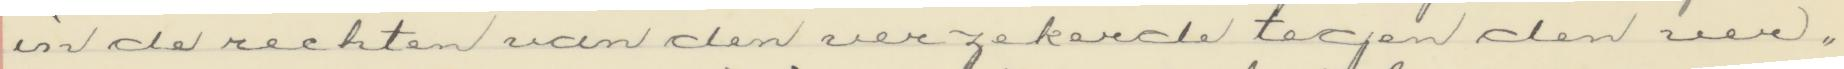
in de rechten van den verzekerde tegen den ver„
